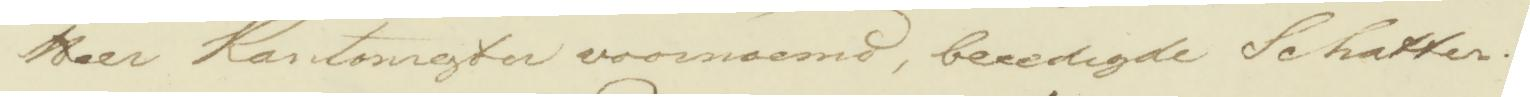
Heer Kantonregter voornoemd, beeedigde Schatter.
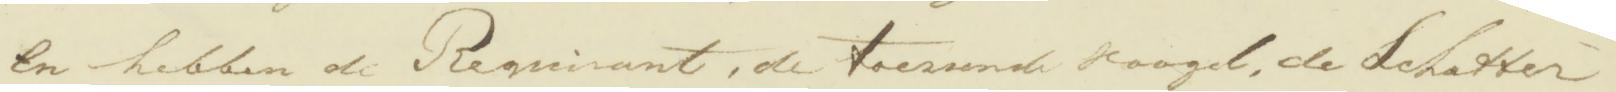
En hebben de Requirant, de toeziende voogd, de Schatter
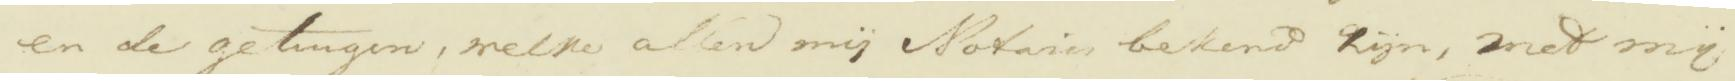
en de getuigen, welke allen mij Notaris bekend zijn, met mij
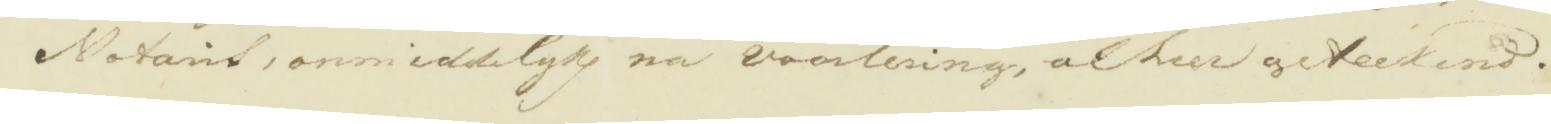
Notaris, onmiddelijk na voorlezing, alhier geteekend.
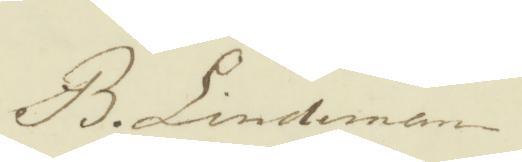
B. Lindeman
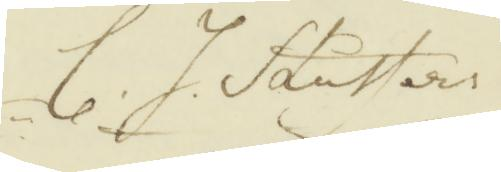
C. J. Stuffers
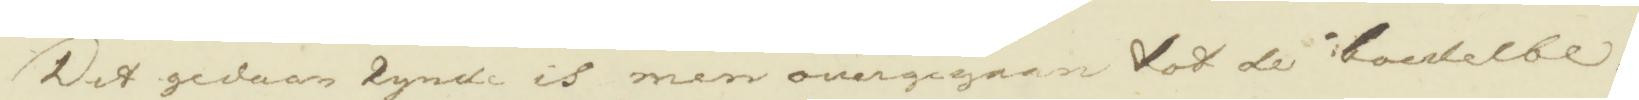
Dit gedaan zynde is men overgegaan tot de boedelbe
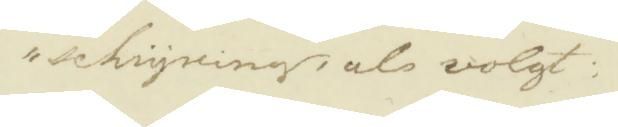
„schrijving, als volgt:
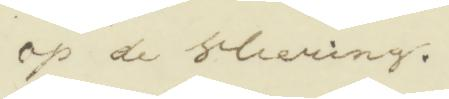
op de Vliering.
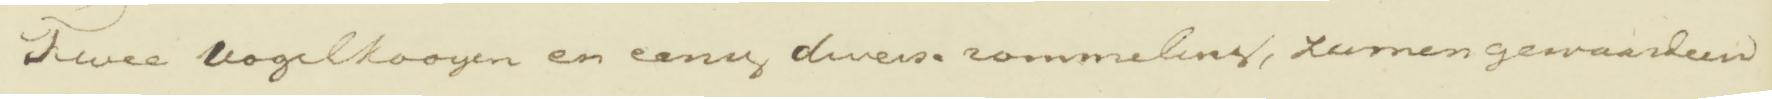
Twee vogelkooyen en eenig diverse rommeling, zamen gewaardeerd
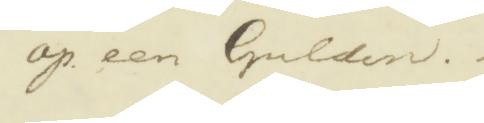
op een Gulden.
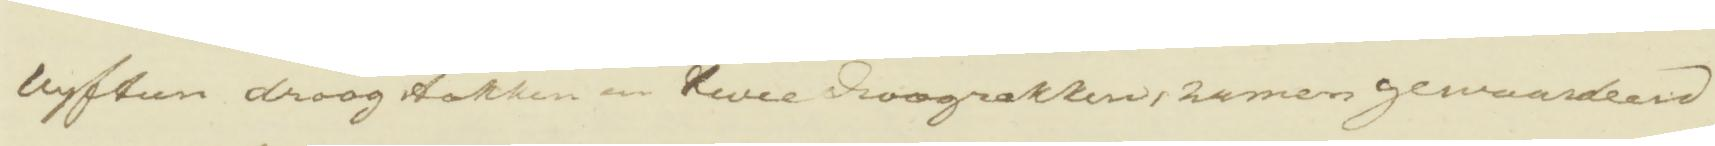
vyftien droog stokken en twee droogrekken, zamen gewaardeerd
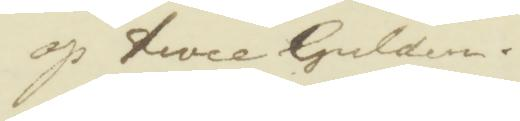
op twee Gulden.
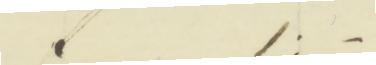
f 1: -
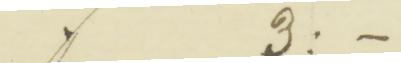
f 3: -
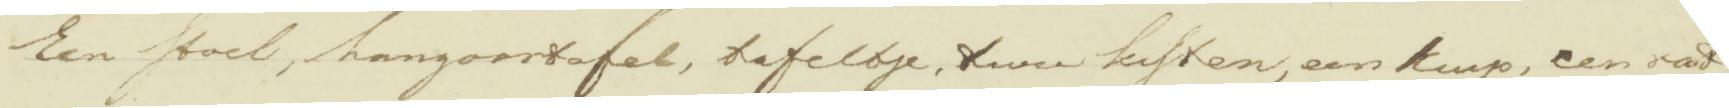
Een stoel, hangoortafel, tafeltje, twee kisten, een kuip, een vat,
